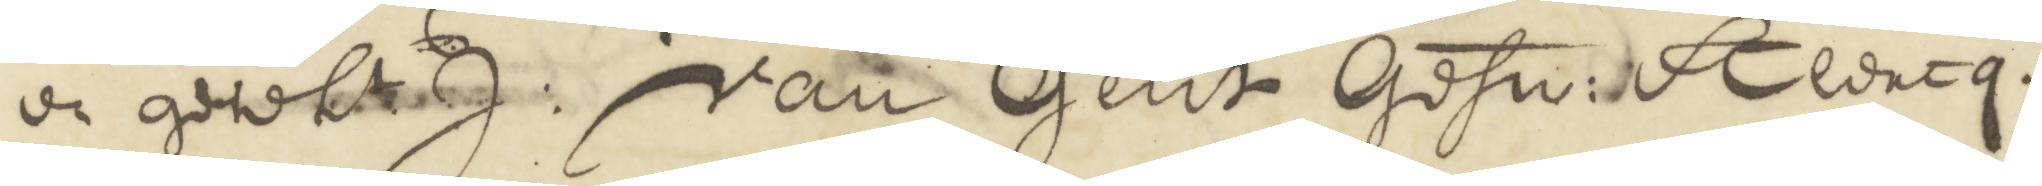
en getek.t J: van Gent Gesn: SClercq.
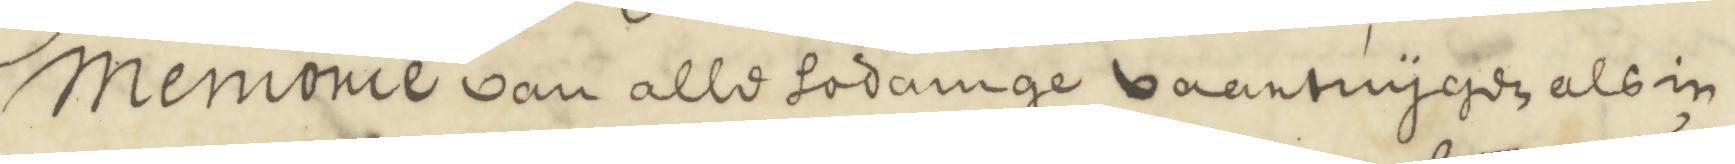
Memorie van alle sodanige vaartuijgen als in
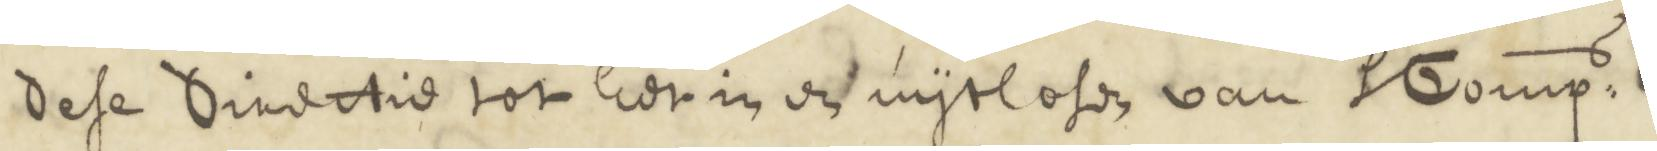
dese directie tot het in en uijtlosen van sComp„s
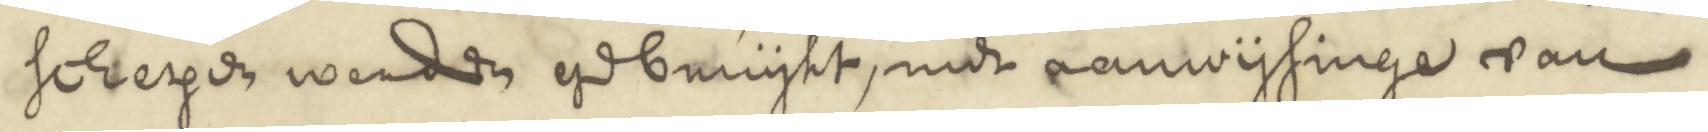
schepen werden gebruijkt, met aanwijsinge van
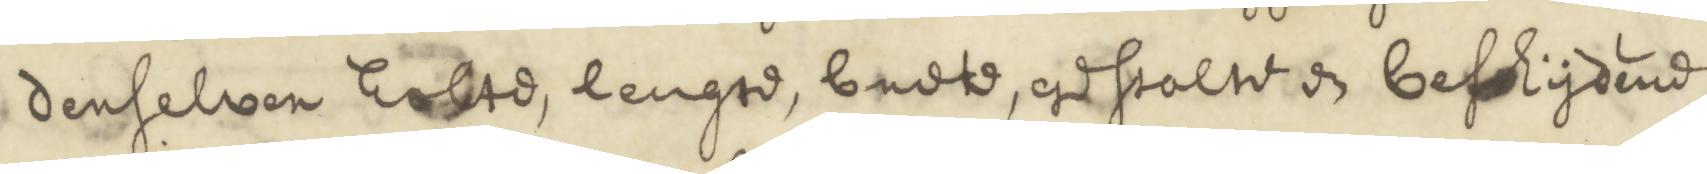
derselver holte, lengte, brete, gestalte en beschijdene
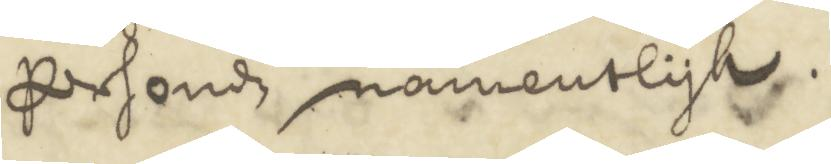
personen namentlijk.
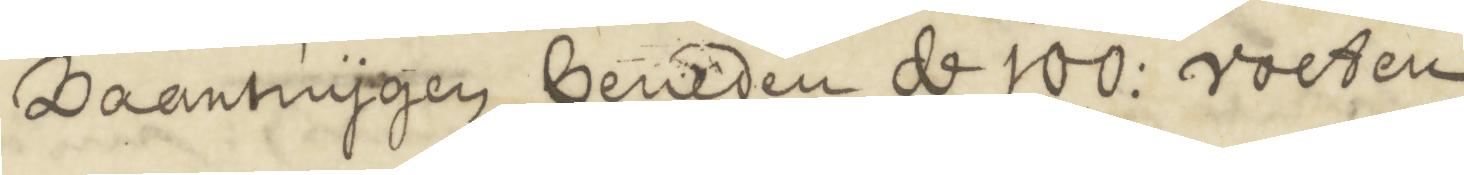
vaartuijgen beneden de 100: voeten
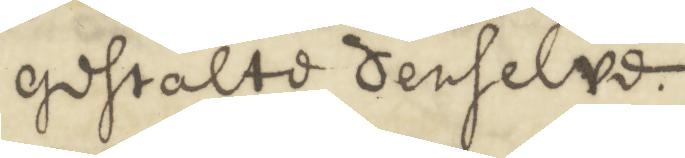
gestalte derselve.
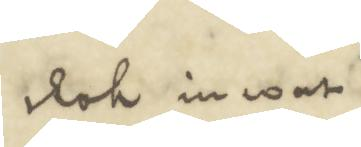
hok in wat
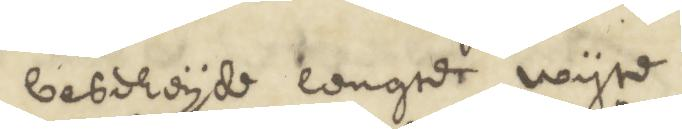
bescheijde lengte wijte
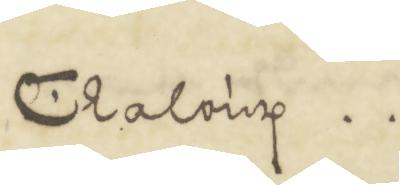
Chaloup .
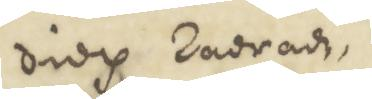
diep haer aen,
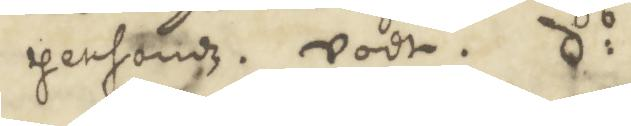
personen. voet. d:o
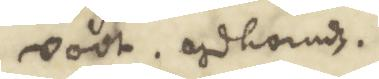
voet. gekomen.
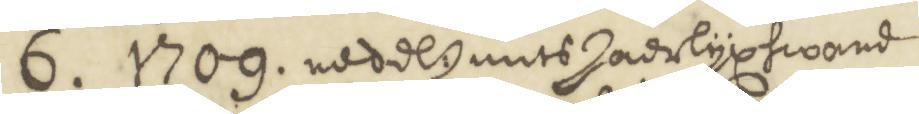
6. 1709. redelijk mits jaarlijx sware
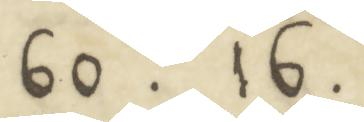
60. 16.
